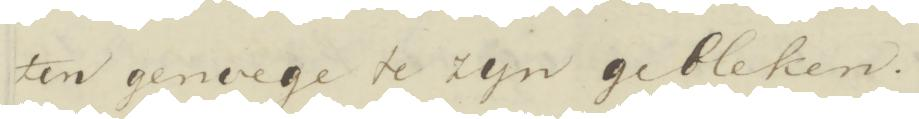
ten genoege te zijn gebleken.
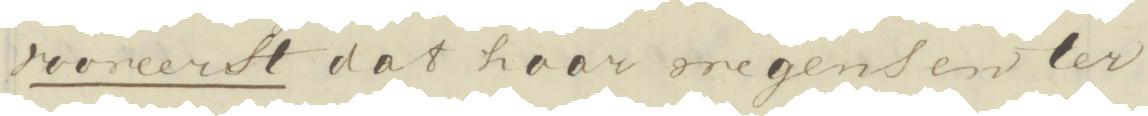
vooreerst dat haar wegens en ter
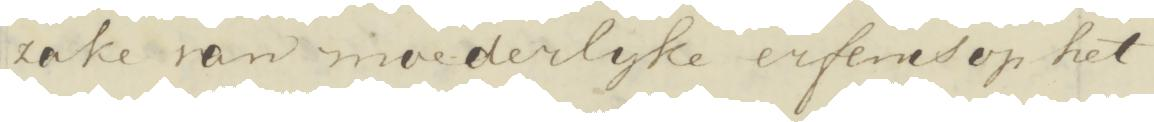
zake van moederlyke erfenis op het
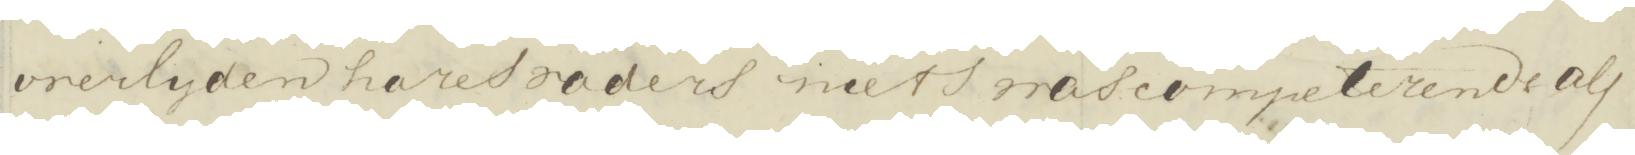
overlyden hares vaders niets was competerende als
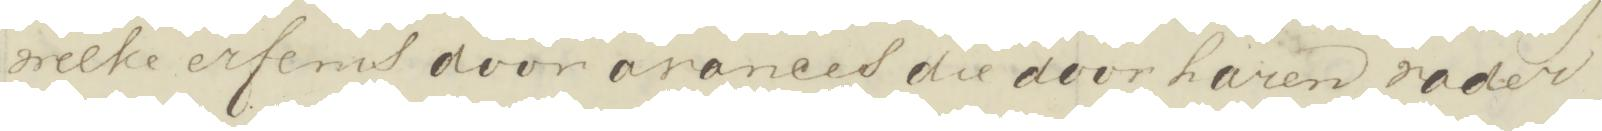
welke erfenis door avances die door haren vader
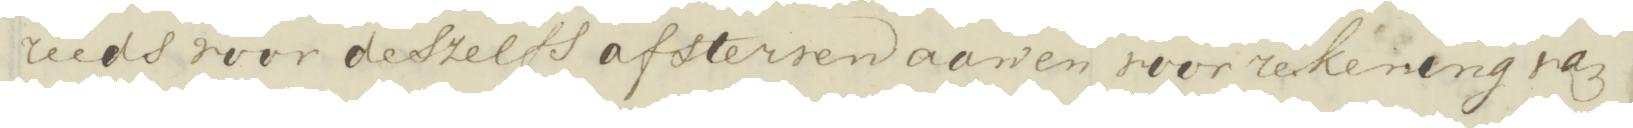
reeds voor deszelfs afsterven aan en voor rekening van
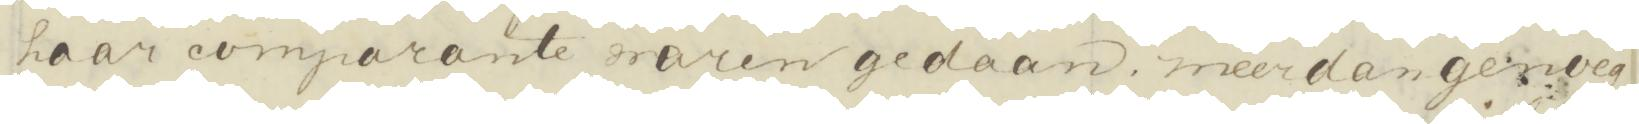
haar comparante waren gedaan, meer dan genoeg
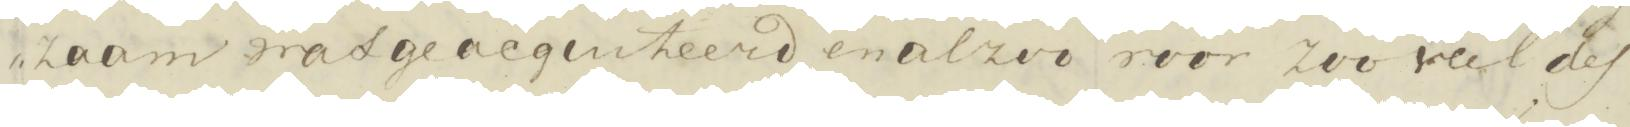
„zaam was geacquiteerd en alzoo voor zoo veel des
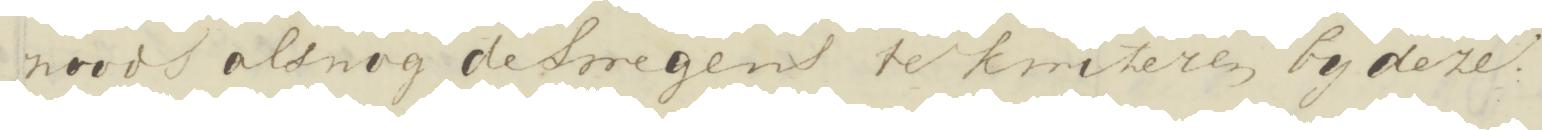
noods alsnog deswegens te kwiteren by deze.
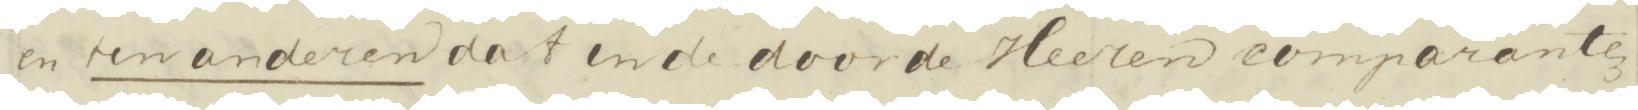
en ten anderen dat in de door de Heeren comparanten
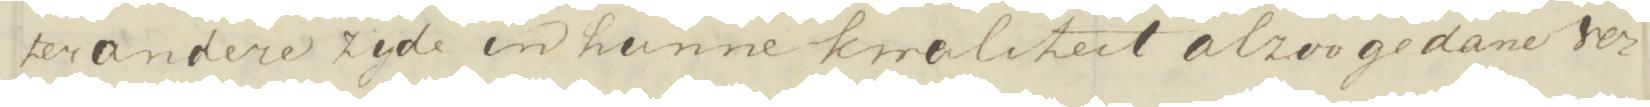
ter andere zyde in hunne kwaliteit alzoo gedane ver
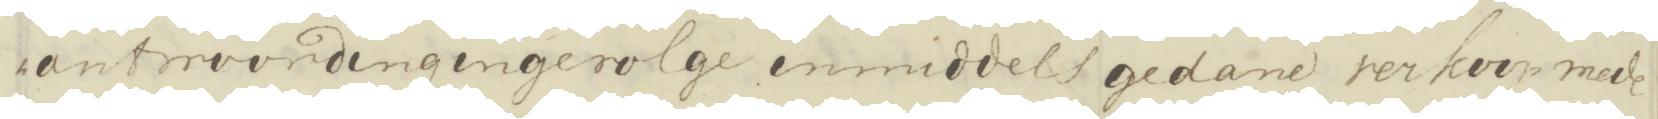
„antwoording ingevolge inmiddels gedane verkoop mede
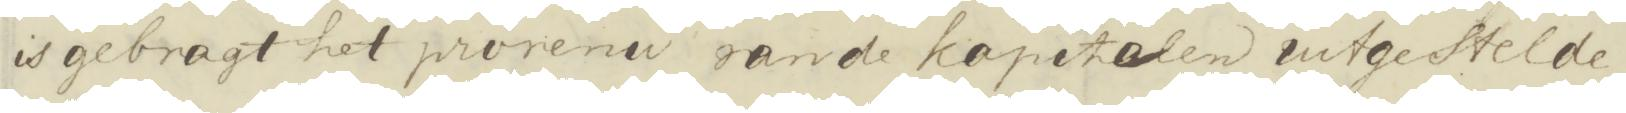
is gebragt het provenu van de kapitalen uitgestelde
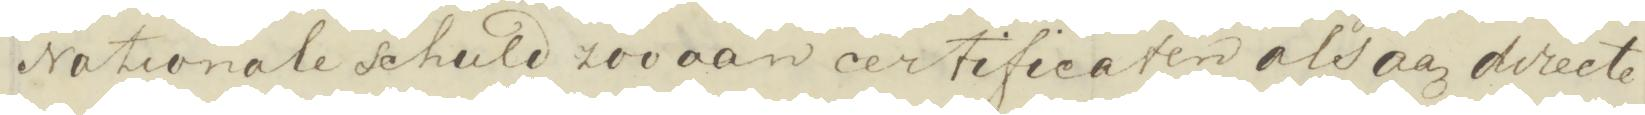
Nationale Schuld zoo aan certificaten als aan directe
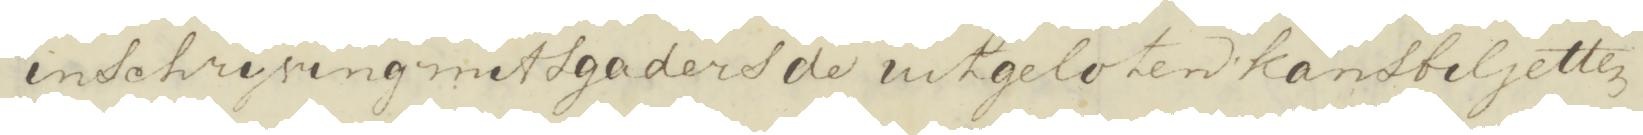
inschryving mitsgaders de uitgeloten kansbiljetten
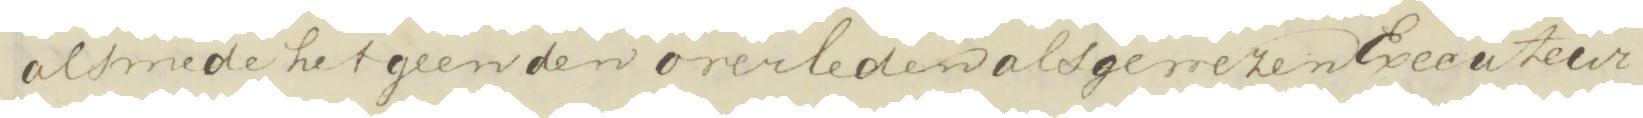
alsmede hetgeen den overleden als gewezen Executeur
